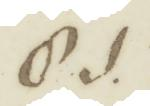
81.
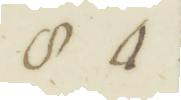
8 4
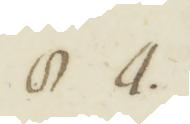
8 4.
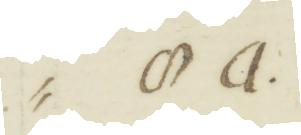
„ 84:
